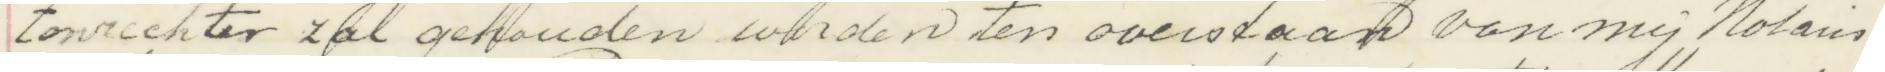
tonrechter zal gehouden worden ten overstaan van mij Notaris
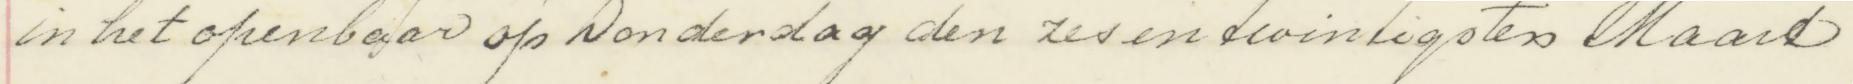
in het openbaar op Donderdag den zes en twintigsten Maart
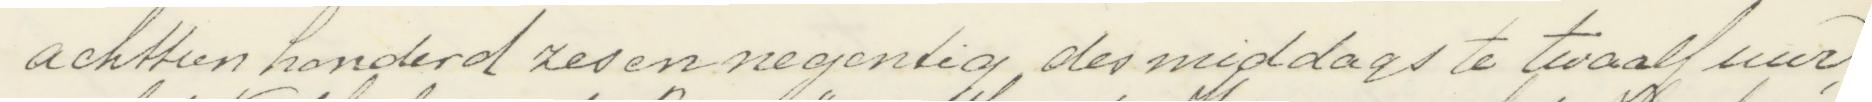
achttien honderd zes en negentig des middags te twaalf uur,
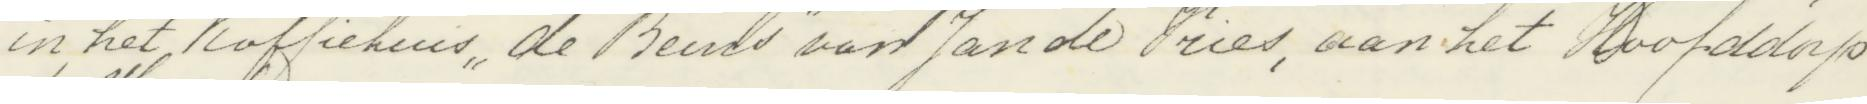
in het Koffiehuis „ de Beurs van Jan de Vries, aan het Hoofddorp
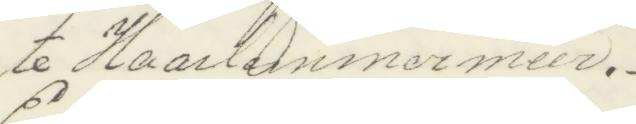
te Haarlemmermeer.
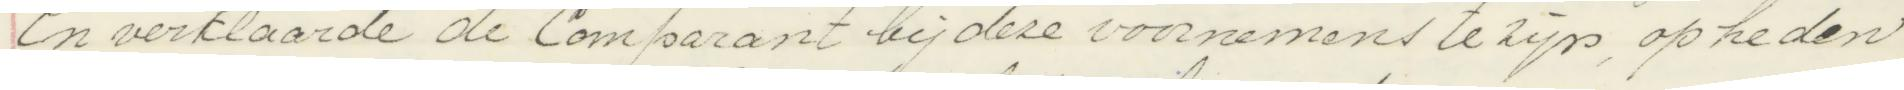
En verklaarde de Comparant bij deze voornemens te zijn, op heden
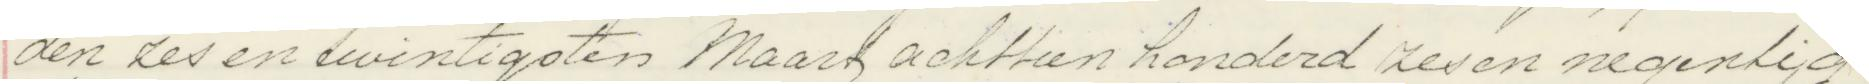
den zes en twintigsten Maart achttien honderd zes en negentig
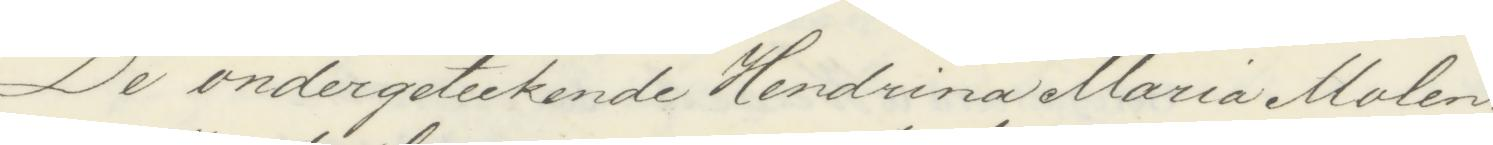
De ondergeteekende Hendrina Maria Molen
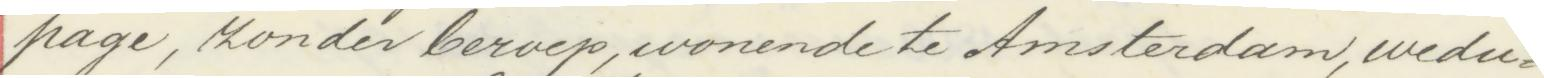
page, zonder beroep, wonende te Amsterdam, wedu=
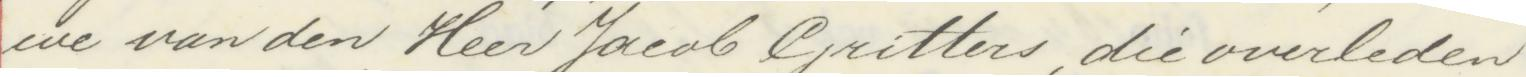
we van den Heer Jacob Gritters, die overleden
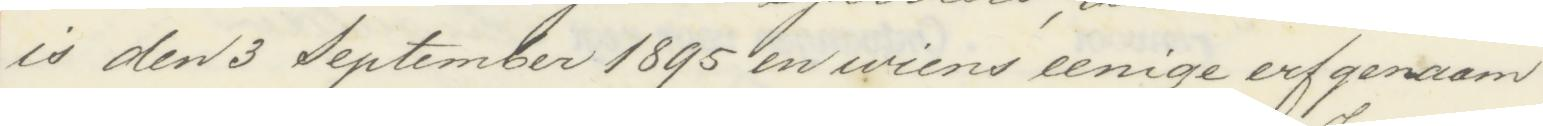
is den 3 September 1895 en wiens eenige erfgenaam
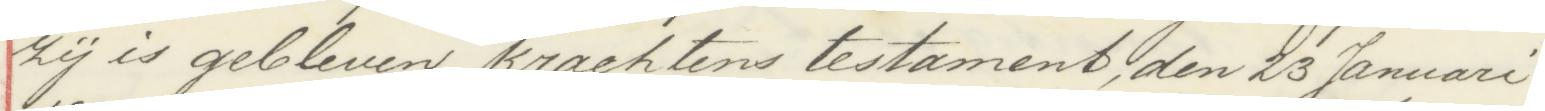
zij is gebleven, krachtens testament, den 23 Januari
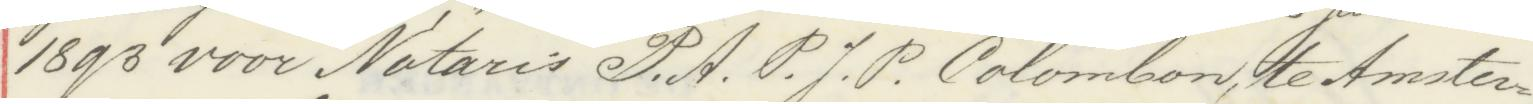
1893 voor Notaris P. A. P. J. P. Colombon, te Amster
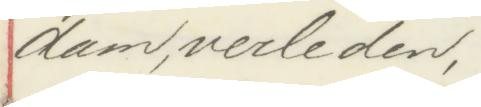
dam, verleden,
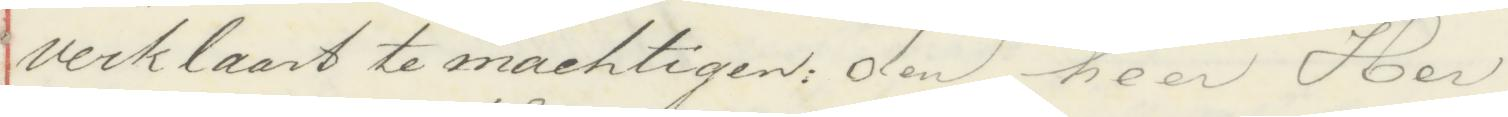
verklaart te machtigen: den heer Her
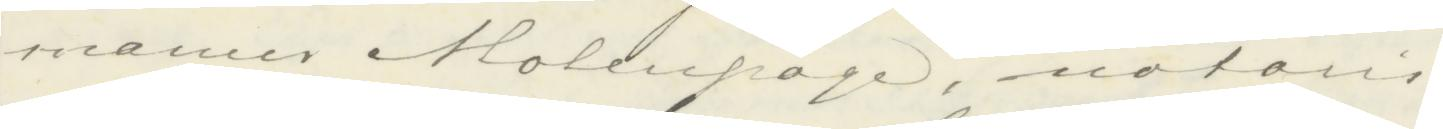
manus Molenpage, notaris
